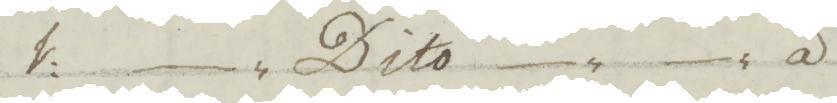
1: —„ Dito —„ —„ a
